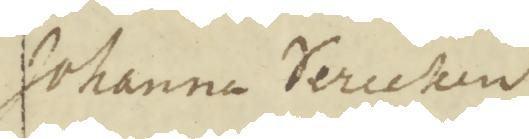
Johanna Vereeken
